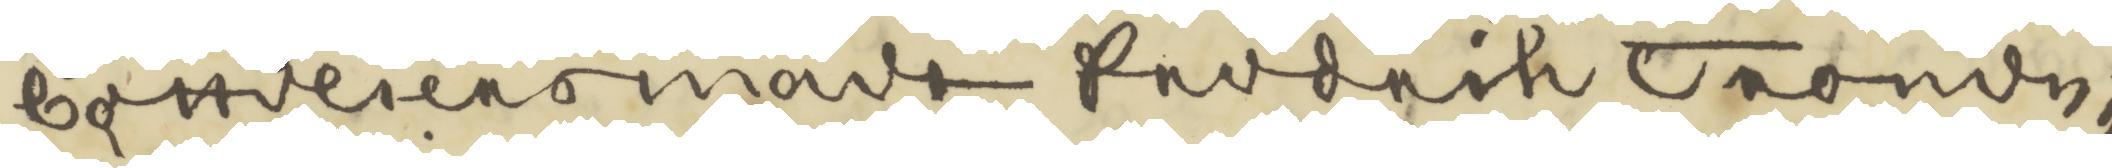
botteliers maet Fredrik Cronen
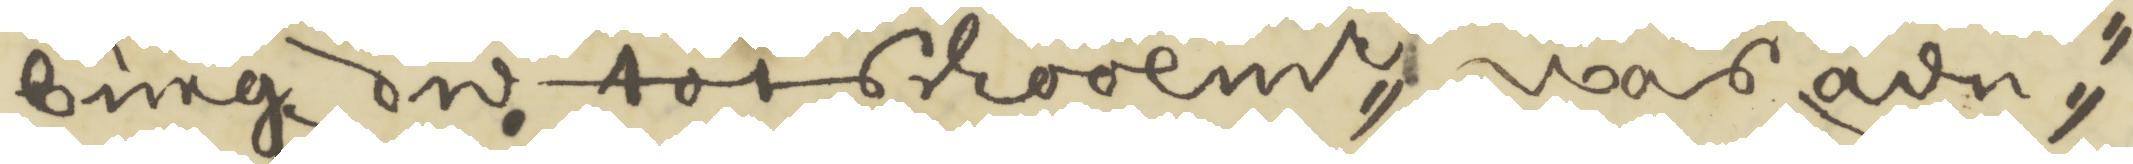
burg die tot schoolm„r was aen„
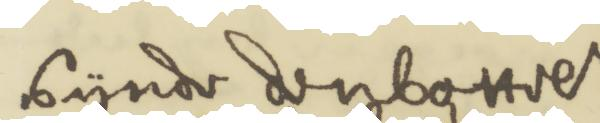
sijnde den bottel:r
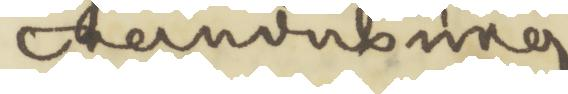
Cranenburg
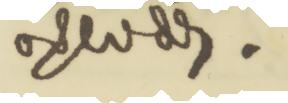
overleden.
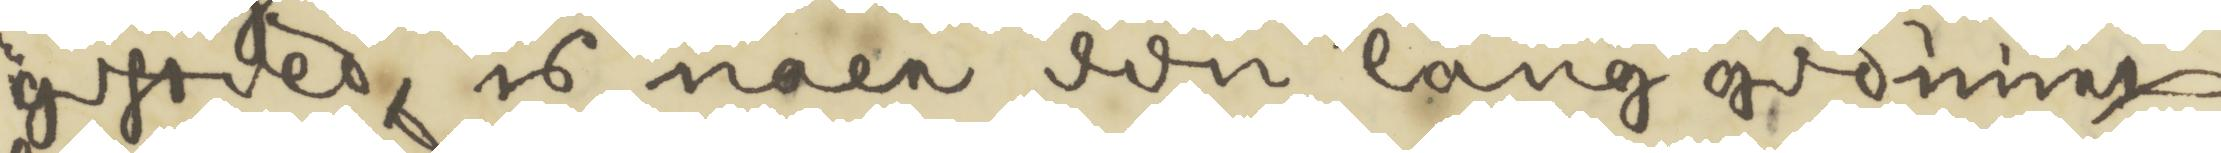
gesteld, is naer een lang geduirt
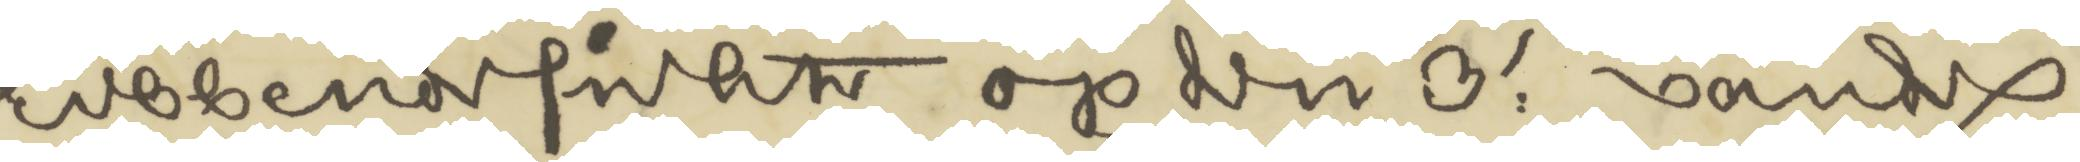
hebbende siekte op den 3:' vande
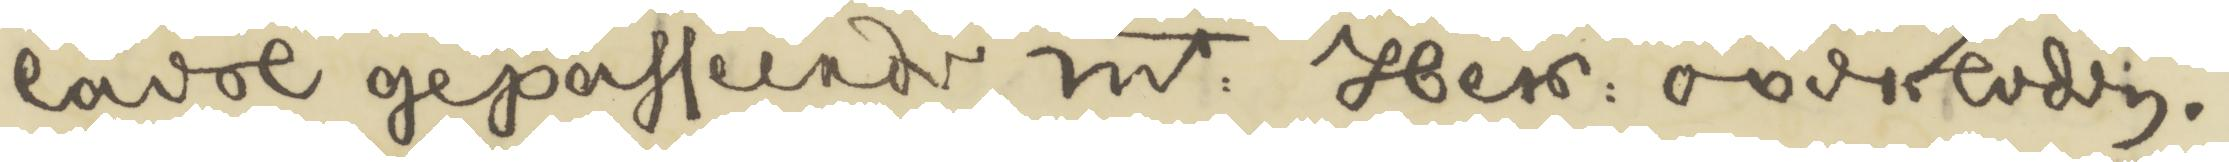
laest gepasseerde m:t 7ers: overleden.
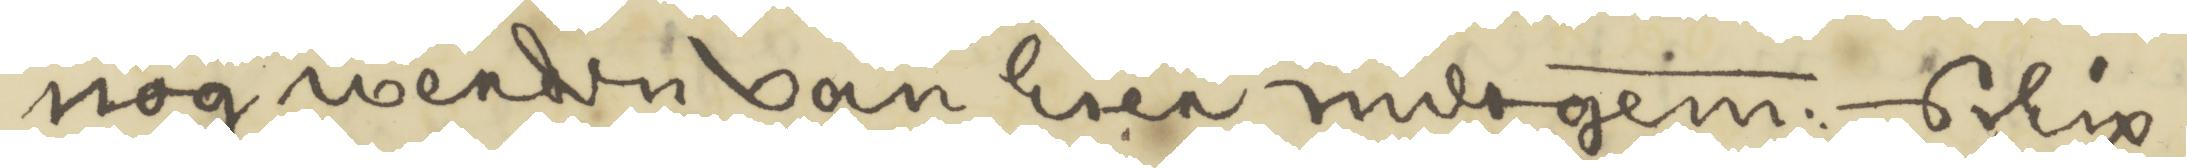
nog werden van hier met gem: schip
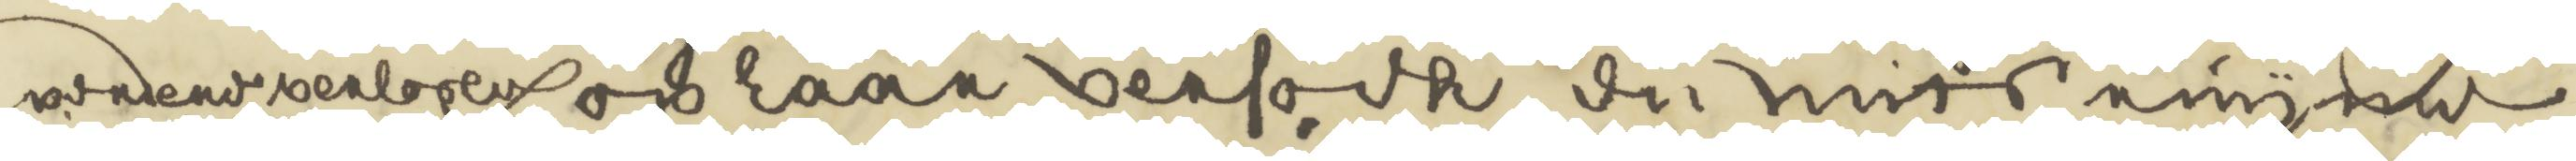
verdere verlopen op haar versoek en mits ruijme
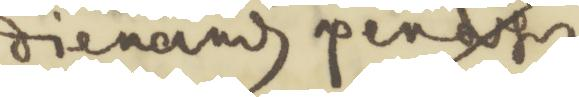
dienaren per desen
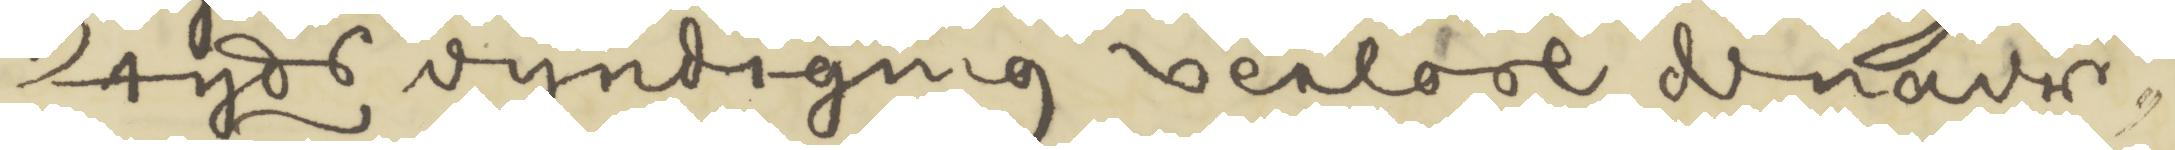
tyds eijndiging verlost de naer„
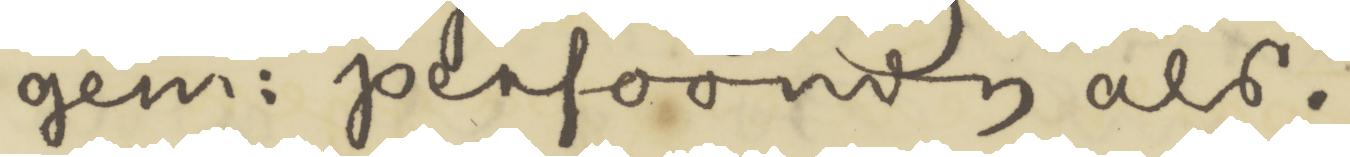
gem: persoonen als.
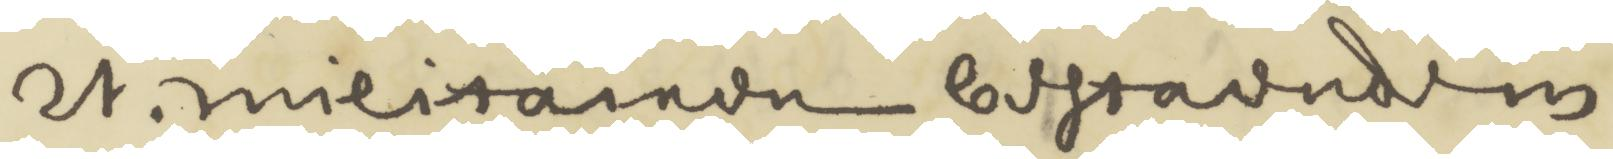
21. militairen bestaende in
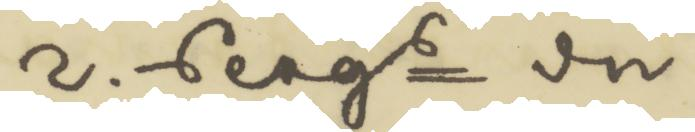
2. serg=s en
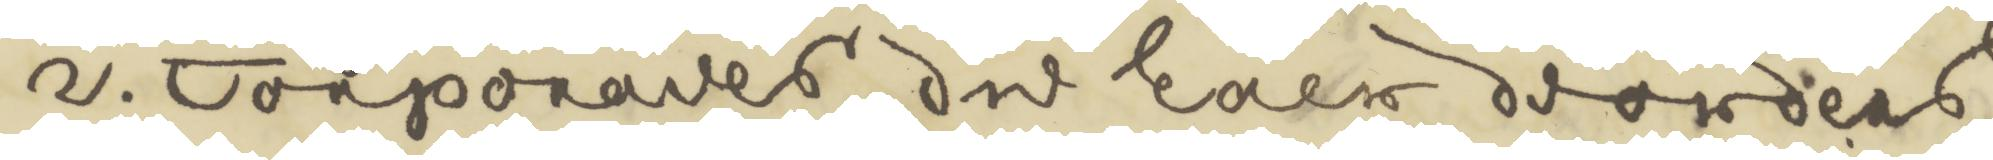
2. Corporaels die haer de orders
